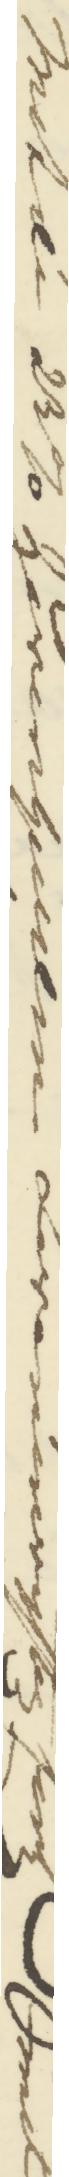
Met de 23% zeven gulden zevenenvyftig cents Onder
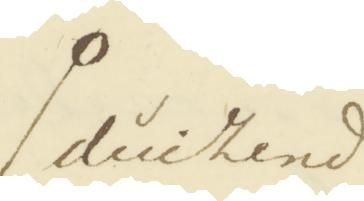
¶ duizend
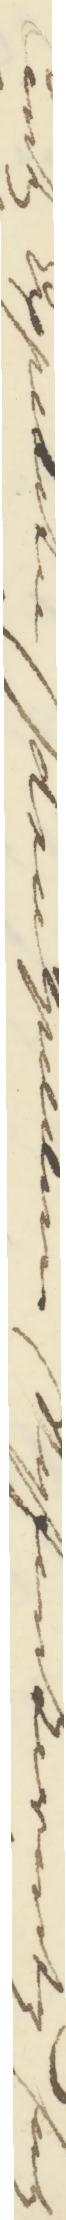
Cent Expeditie drie gulden, vijfenzeventig cents.
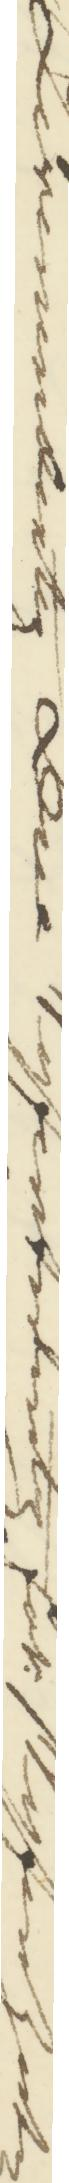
Zevenendertig Drie Vyfentwinting for Vyfenzestig
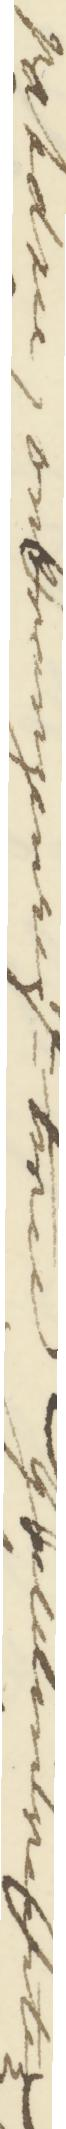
Vak drie, ontvangen req=t twee gulden veertig
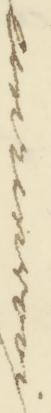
een renvooi
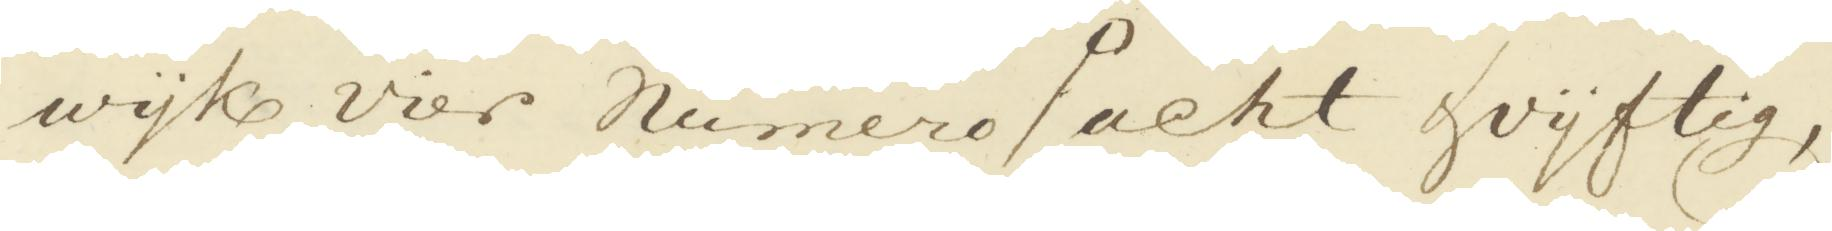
wijk vier numero ¶ acht & vijftig,
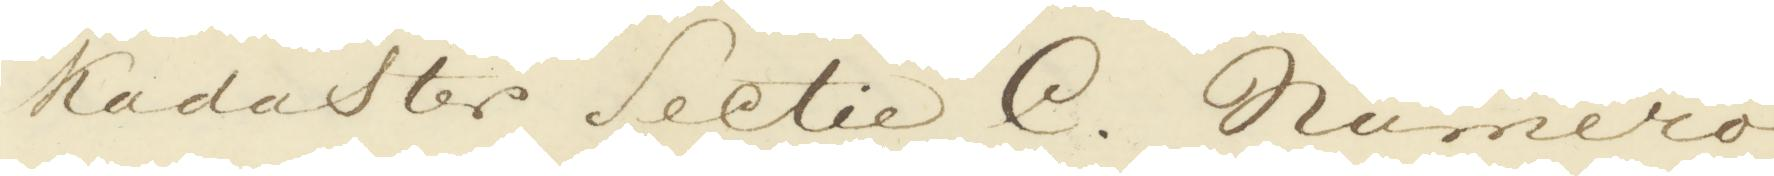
Kadaster sectie C. Numero
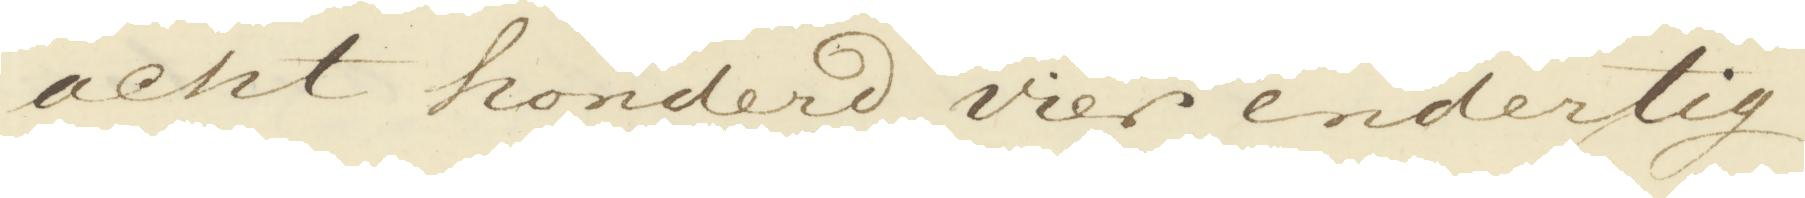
acht honderd vier endertig.
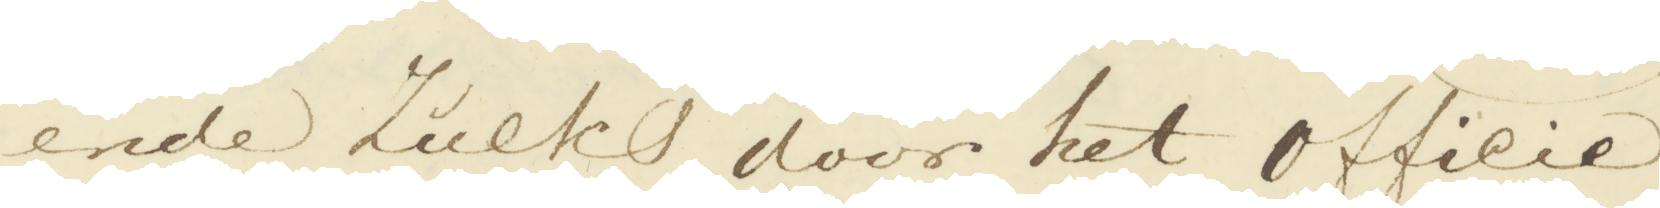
ende zulks door het officie
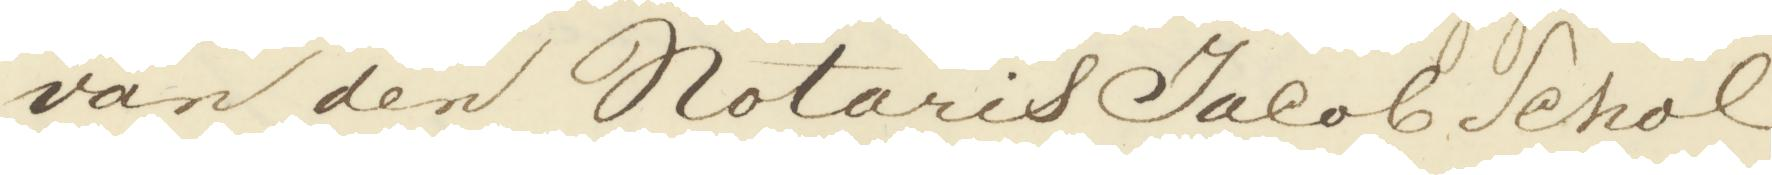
van den Notaris Jacob Schol
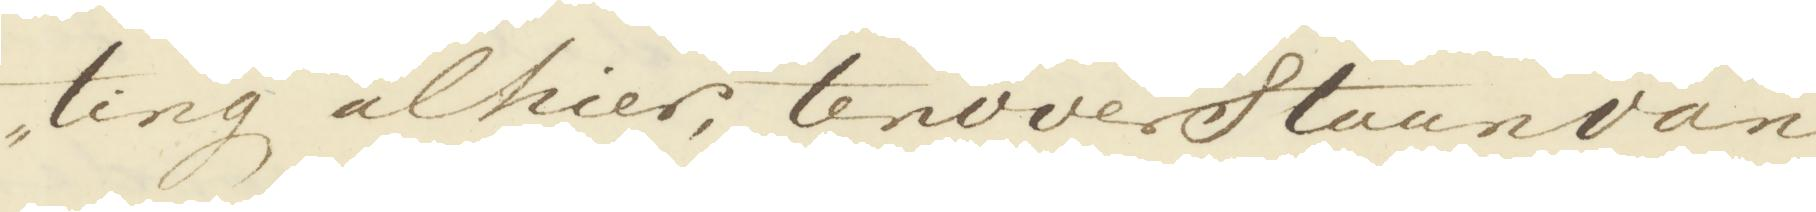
„ting alhier, ten overstaan van
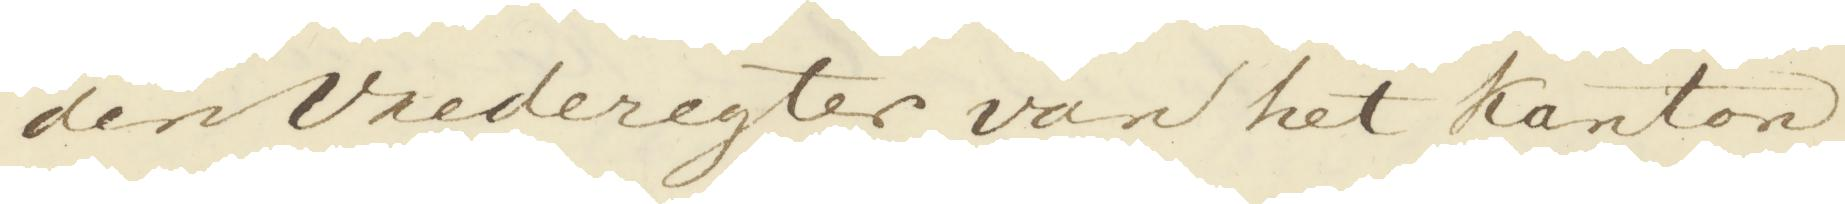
den vrederegter van het kanton
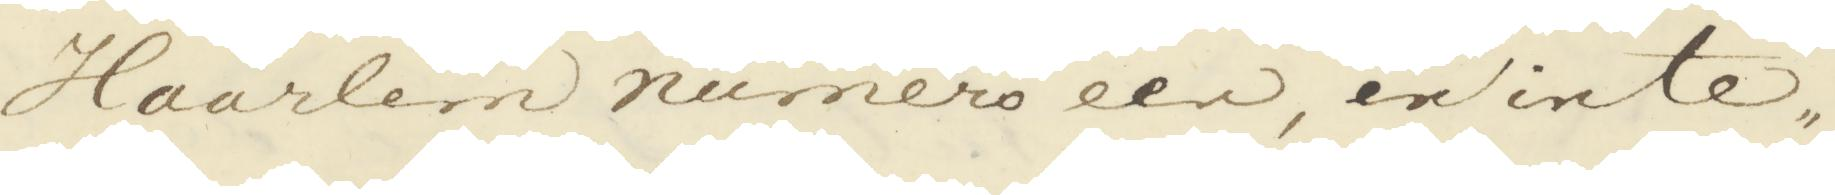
Haarlem numero een, en inte„
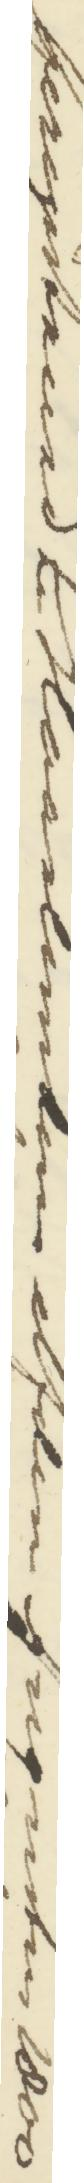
Geregistreerd te Haarlem elfden augustus 1800
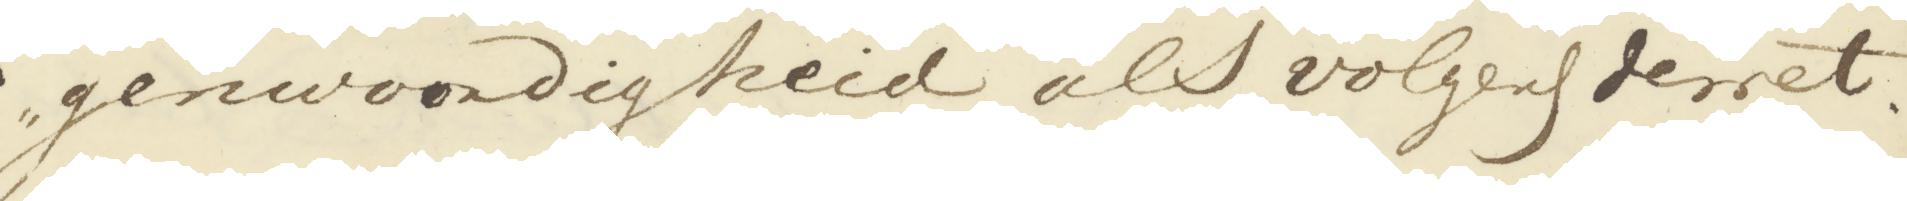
„genwoordigheid als volgens de wet.
